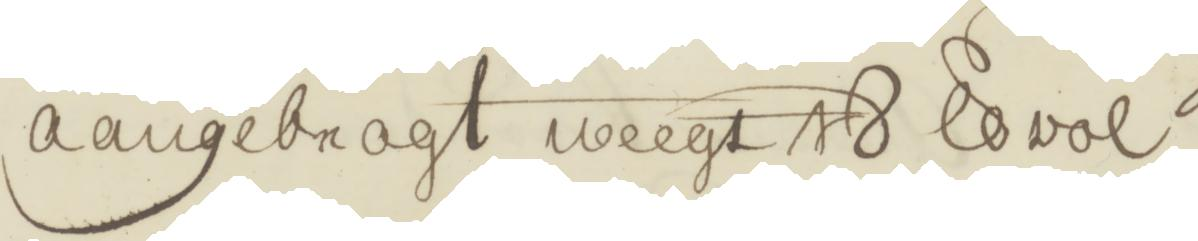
aangebragt weegt 18 lb vol„
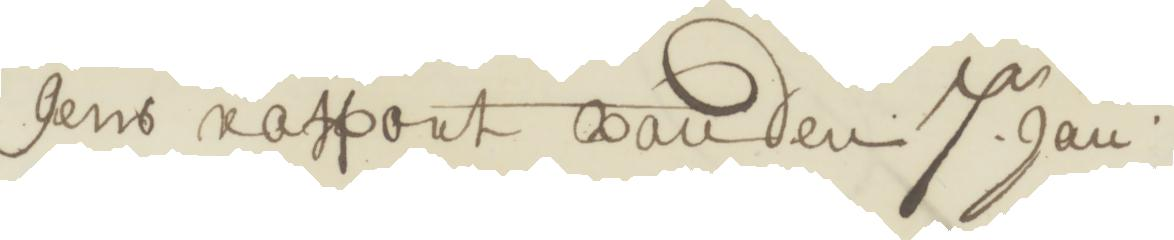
gens rapport van den 7.~ Jan.
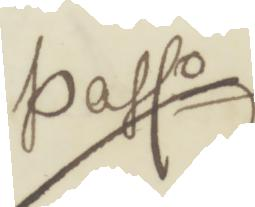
pass=o
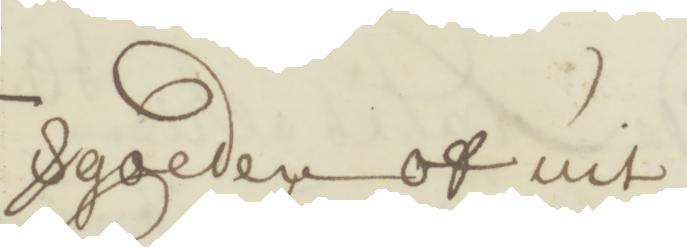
vergoeden of uit
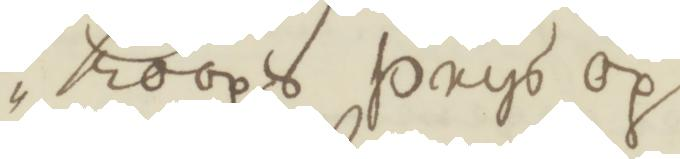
„koops prijs op
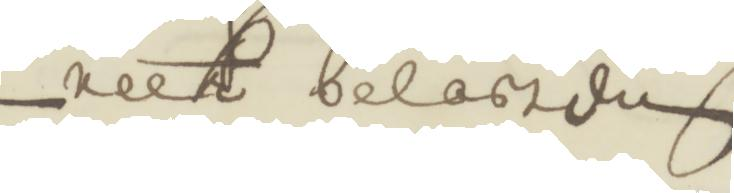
reek belasten
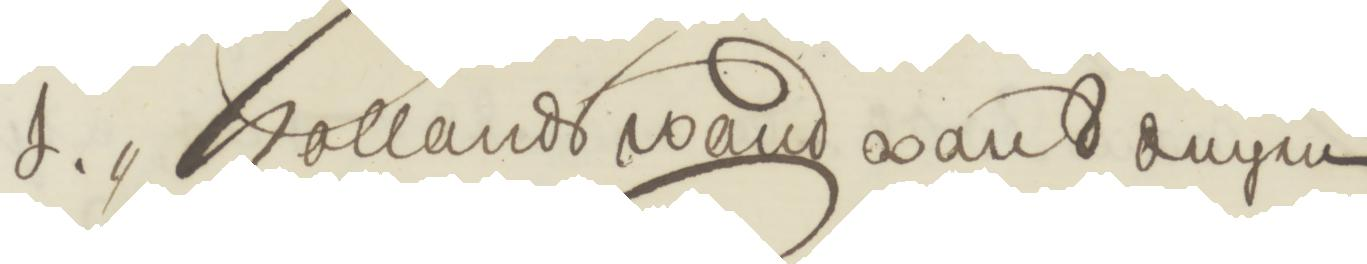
1. „ Hollands wand van 8 duijm
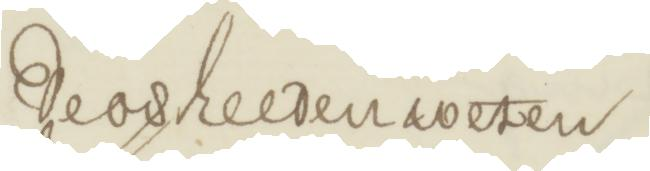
de overheeden weten
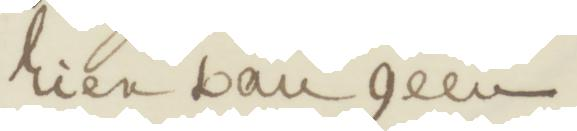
hier van geen
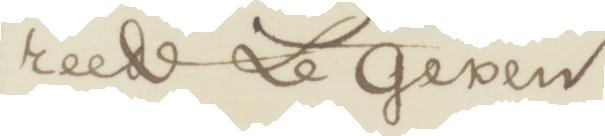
reede te geven
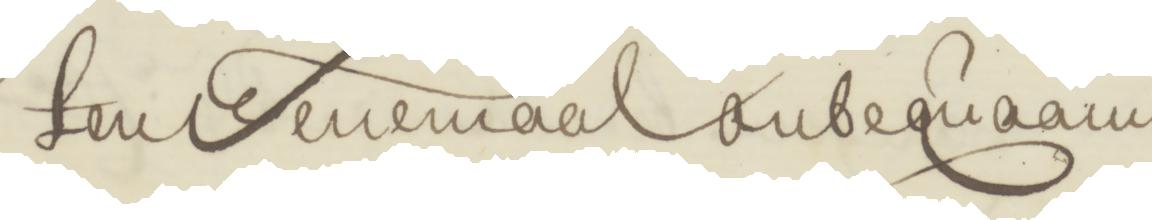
ten Eenemaal onbequaam
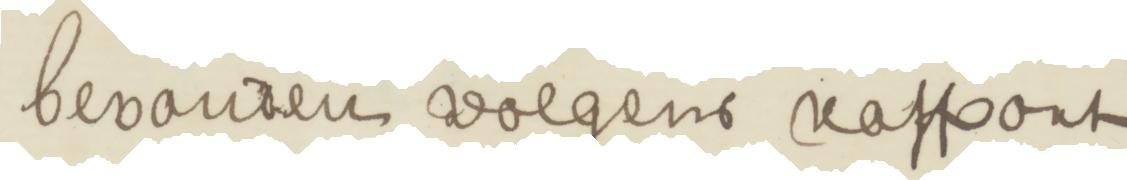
bevonden volgens rapport
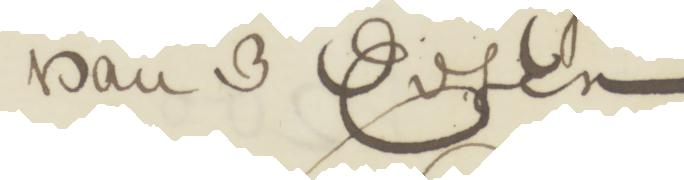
van 3 Deser
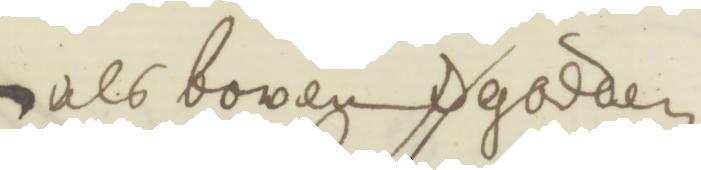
als boven vergoeden
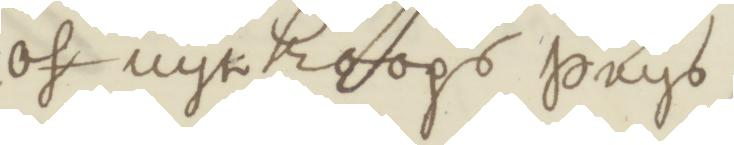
of uijt koops prijs
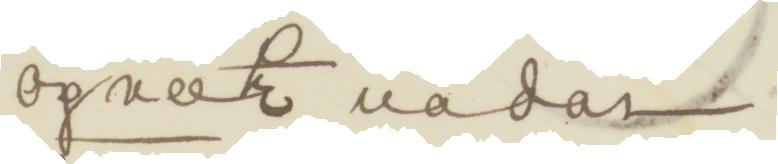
op reek na dat
